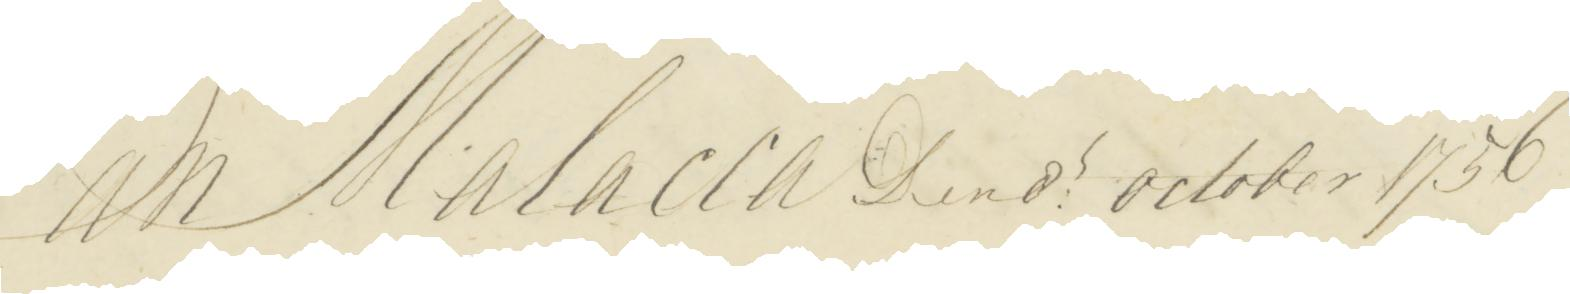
Van Malacca Den 8:' october 1756
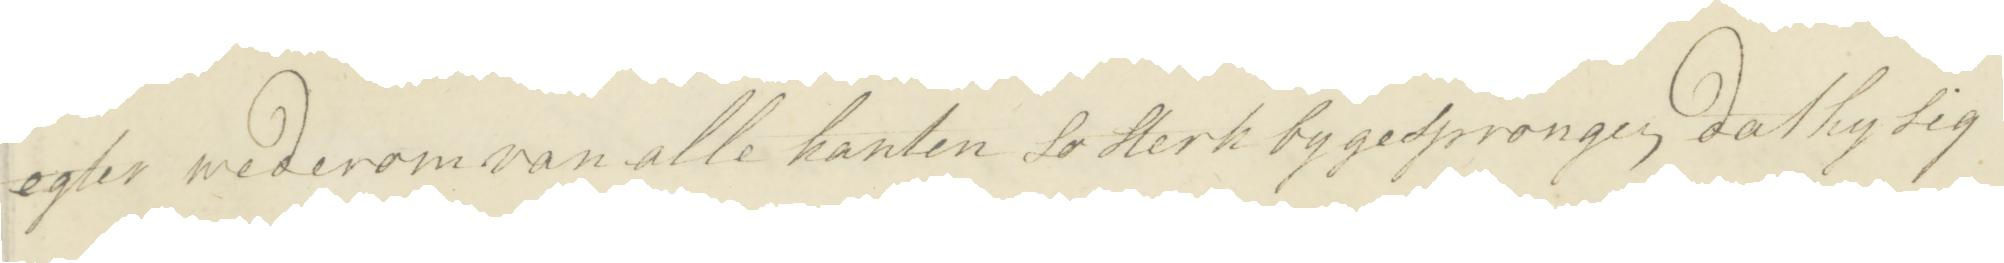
egter wederom van alle kanten so sterk by gesprongen dat hy sig
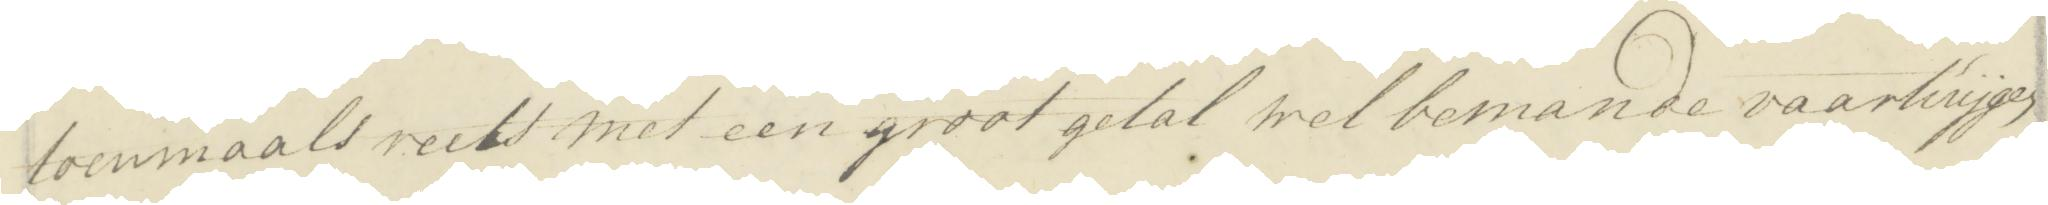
toenmaals reets met een groot getal wel bemande vaartuijgen
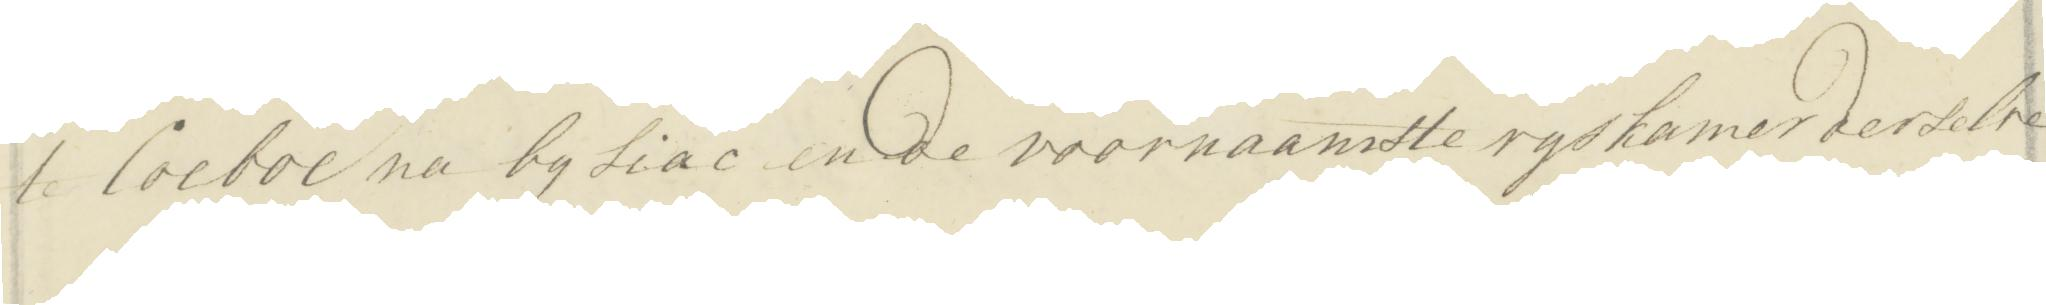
te Coeboe na by siac en de voornaamste ryskamer derselve
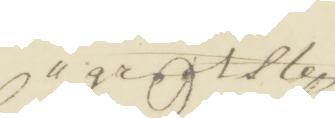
„ grootsten
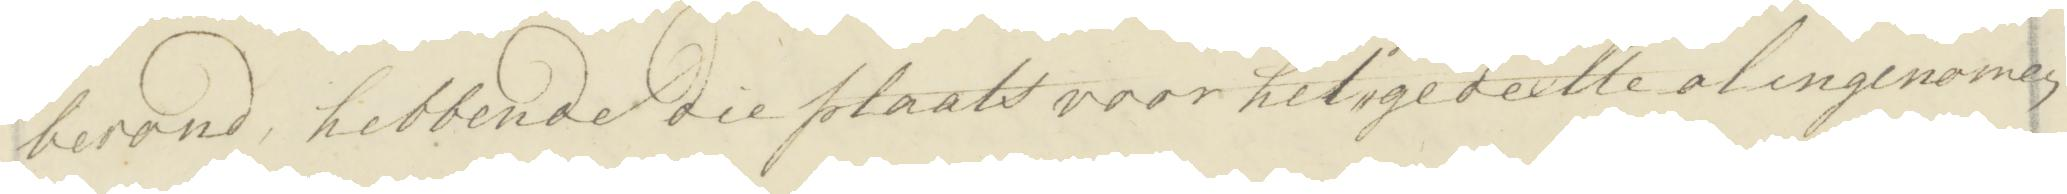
bevond, hebbende die plaats voor het „ gedeelte al ingenomen
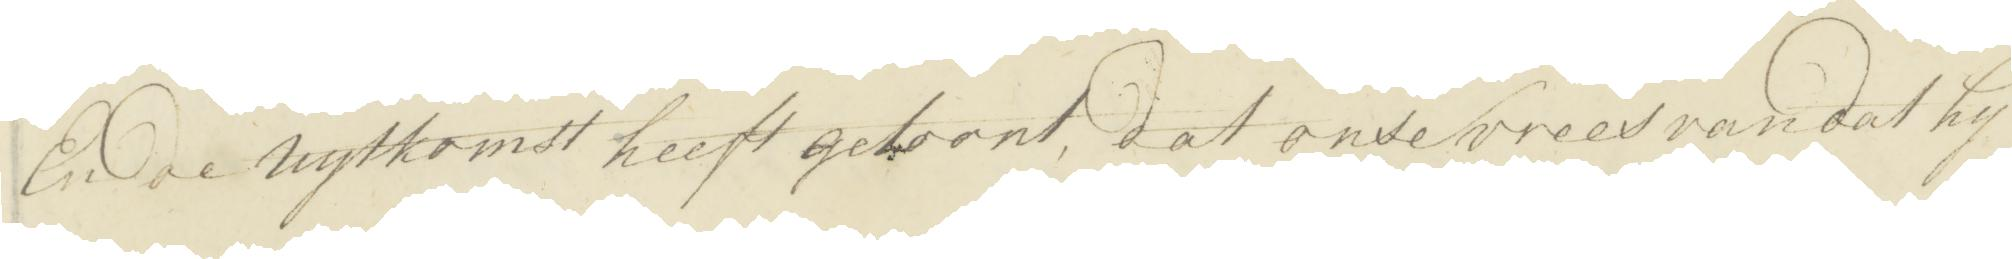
En de uytkomst heeft getoont, dat onse vrees van dat hy
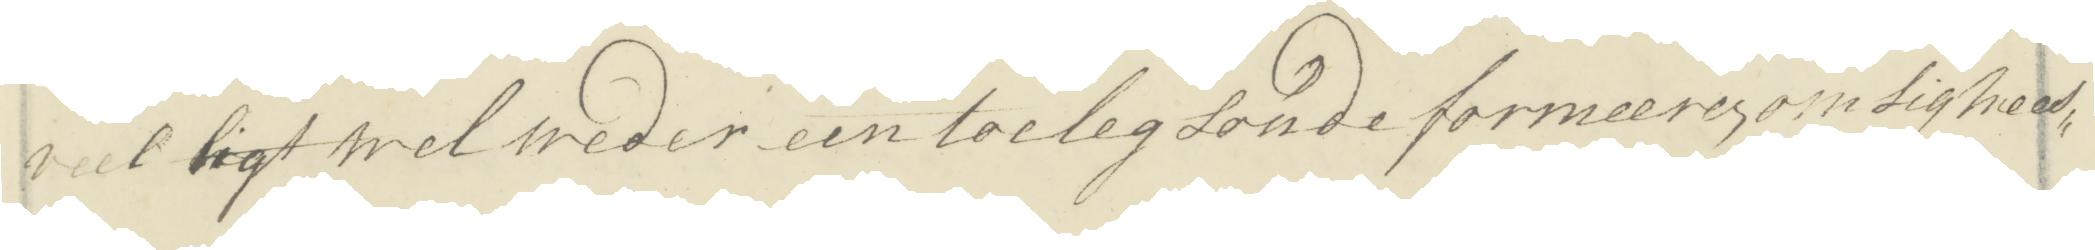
veel ligt wel weder een toeleg soude formeeren om sig mees„
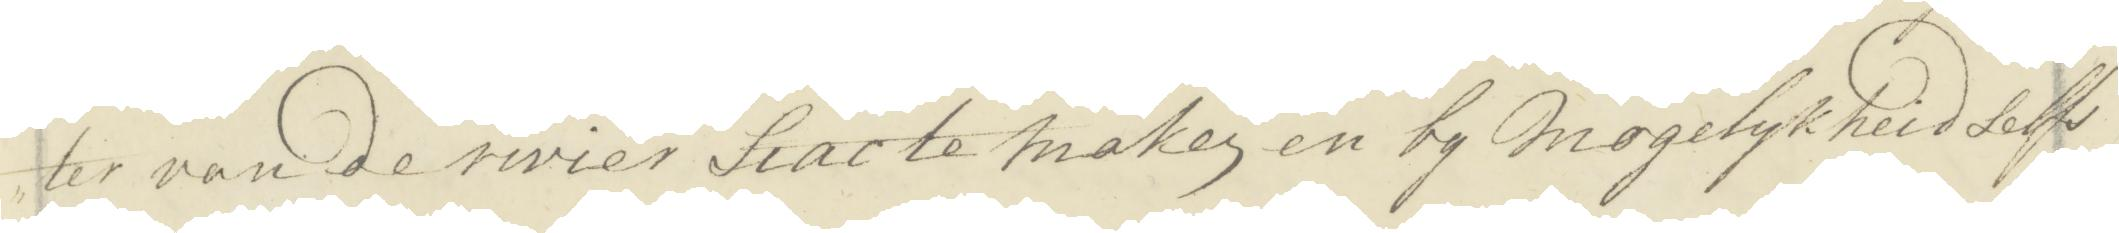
„ter van de rivier siac te maken en by mogelykheid selfs
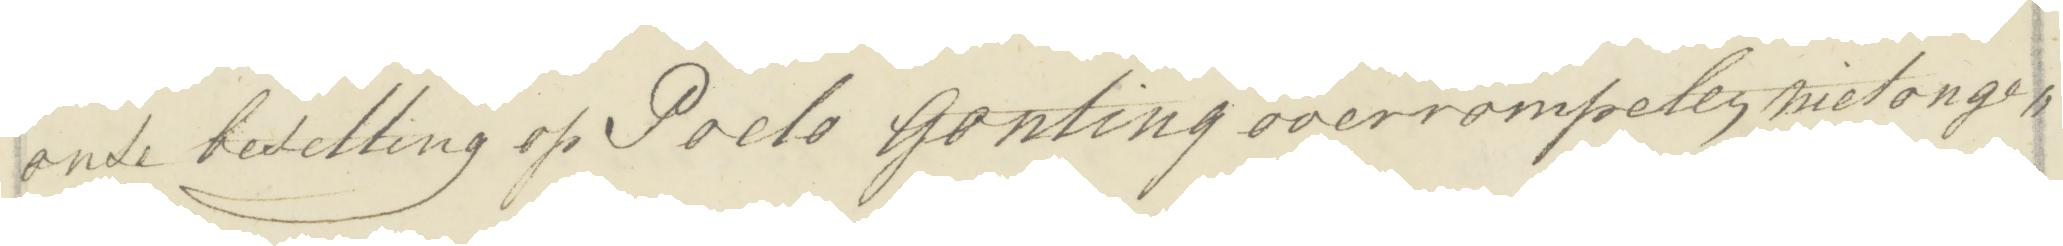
onse besetting op Poelo Gonting overrompelen niet onge„
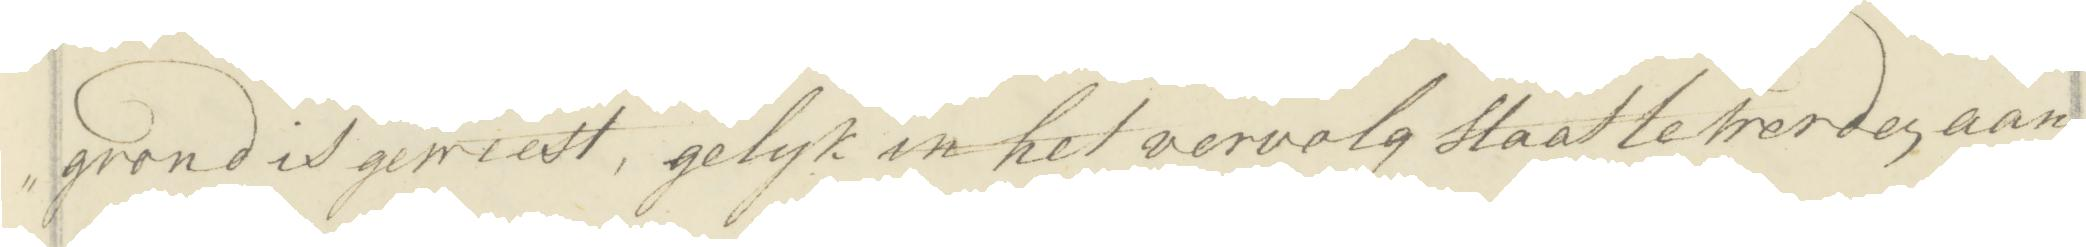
„grond is geweest, gelyk in het vervolg staat te werden aan
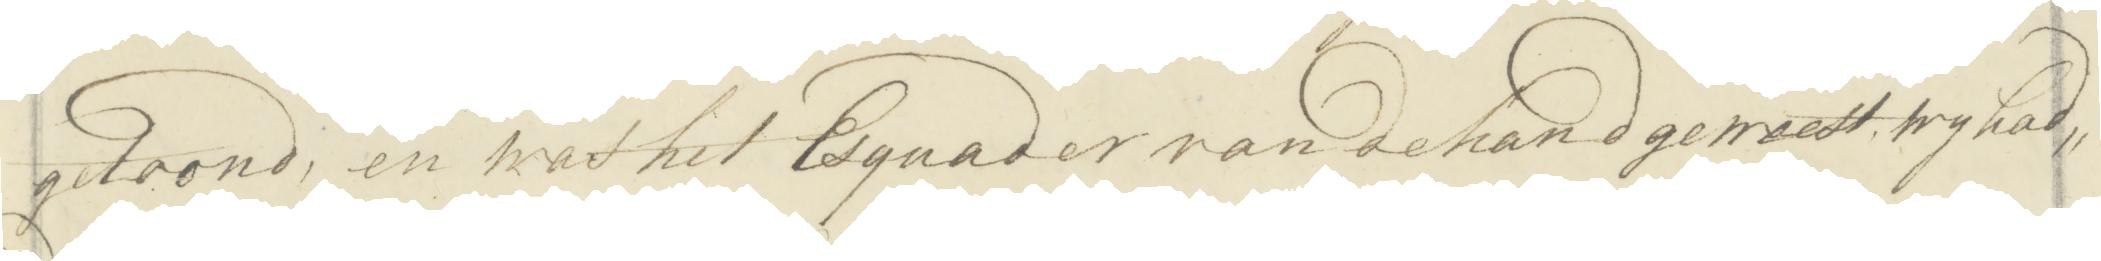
getoond, en was het Esquader van de hand geweest, wy had„
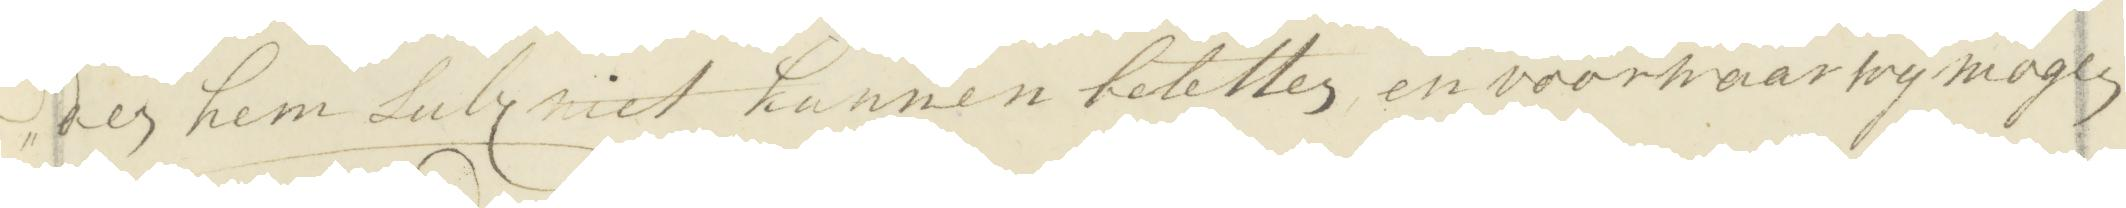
„den hem sulx niet kunnen beletten, en voorwaar wy mogen
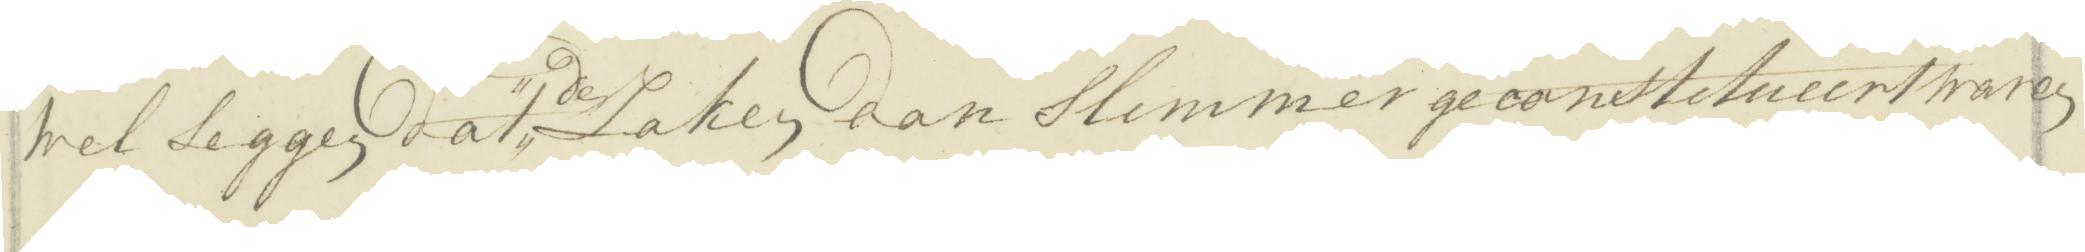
wel seggen, dat „ de zaken dan slimmer geconstitueert waren
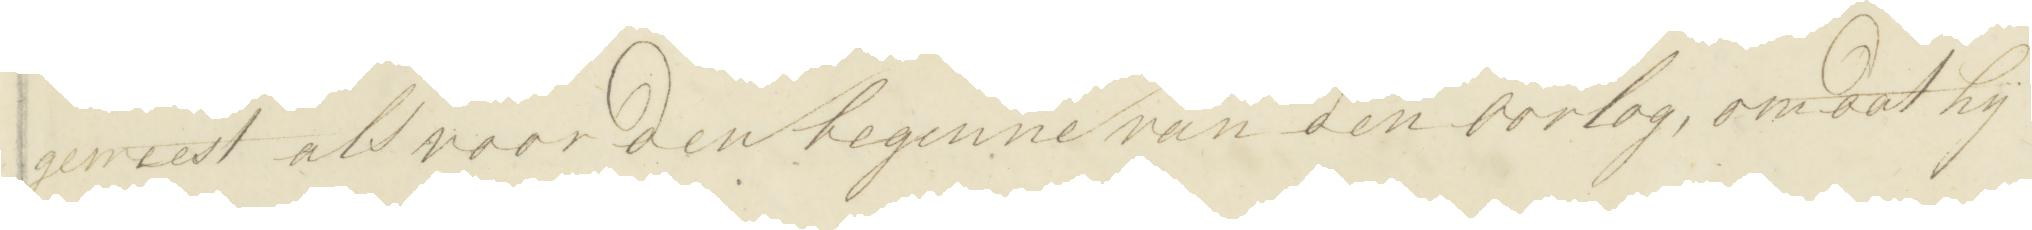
geweest als voor den beginne van den oorlog, omdat hij
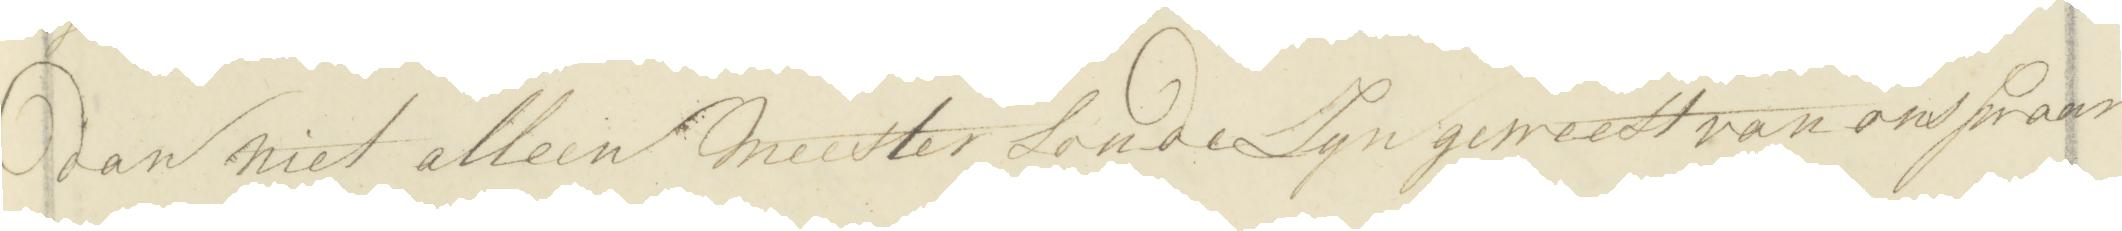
dan niet alleen meester soude zyn geweest van ons swaar
